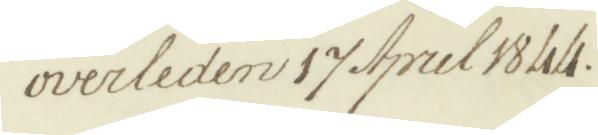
overleden 17 April 1844
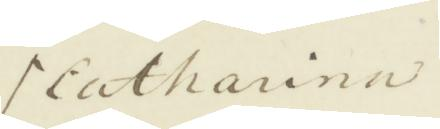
¶ Catharina
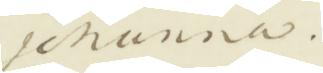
Johanna
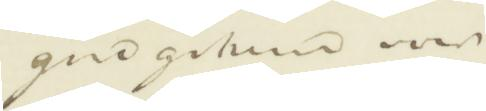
goedgekeurd voor
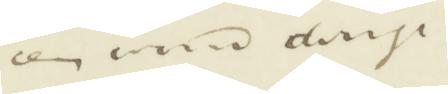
een woord doorge
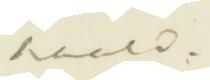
haald.
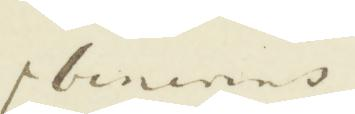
¶ benevens
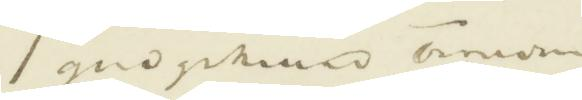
goedgekeurd benevens
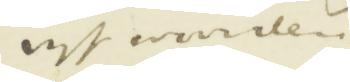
vyf woorden
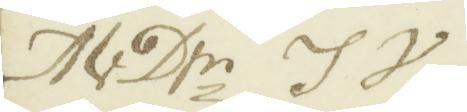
AVDj=r IV
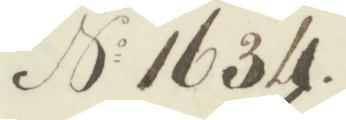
N:o 1634.
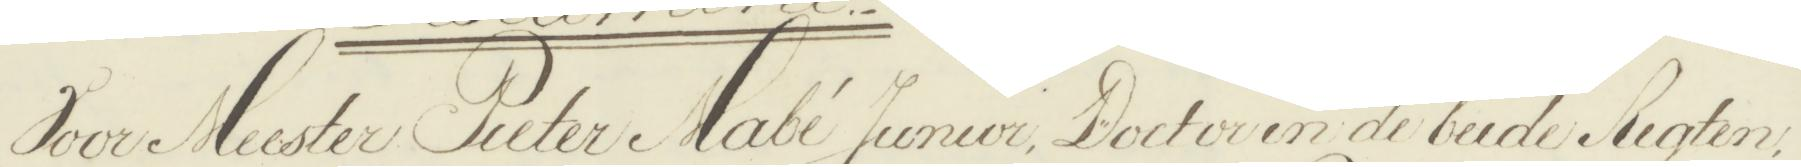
Voor Meester Pieter Mabé Junior, Doctor in de beide Regten,
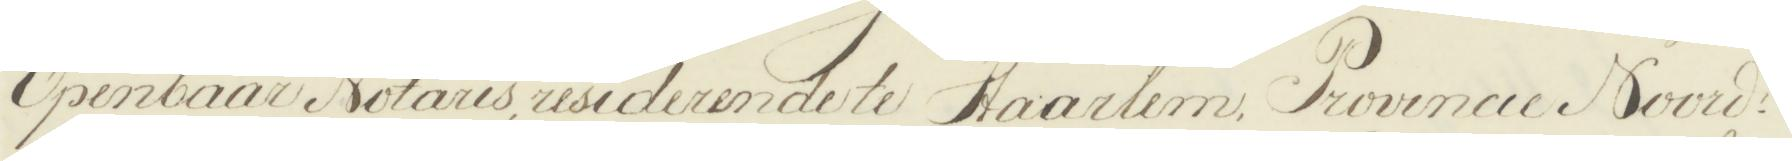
Openbaar Notaris, residerende te Haarlem, Provincie Noord:
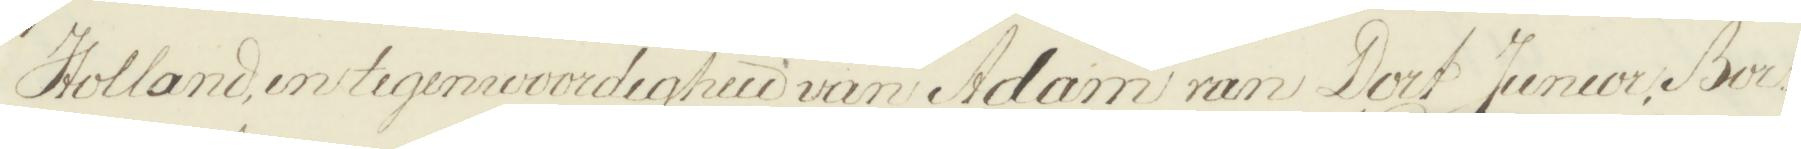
Holland, in tegenwoordigheid van Adam van Dort Junior, Bor„
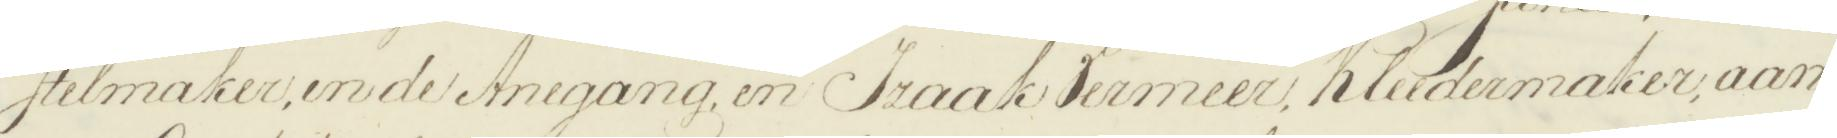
stelmaker, in de Anegang, en Izaak Vermeer, Kleedermaker, aan
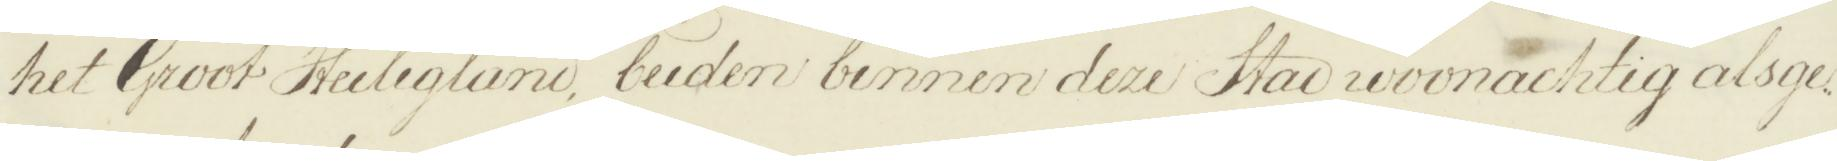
het Groot Heiligland, beiden binnen deze Stad woonachtig als ge
